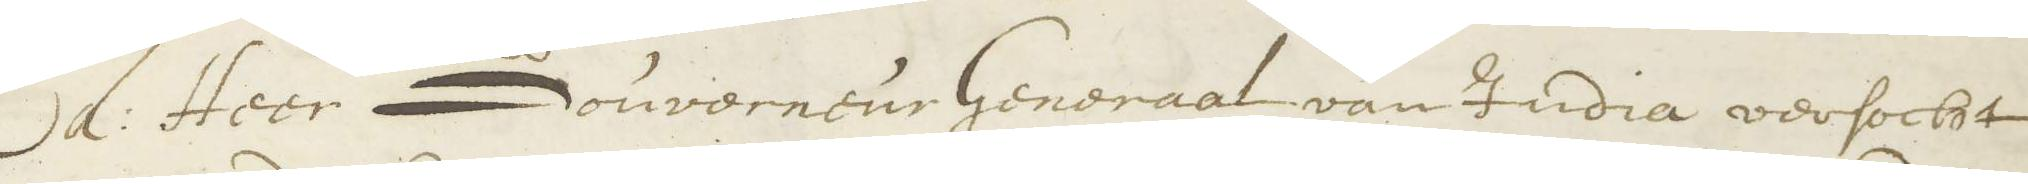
Ed: Heer Gouverneur Generaal van India versocht
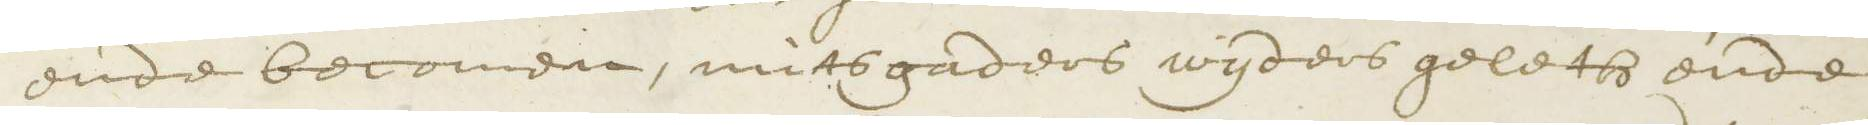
ende becomen, mitsgaders wijders geleth ende
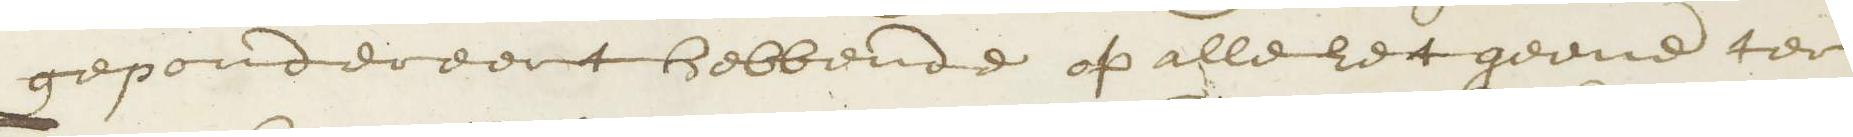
gepondereert hebbende op alle het geene ter
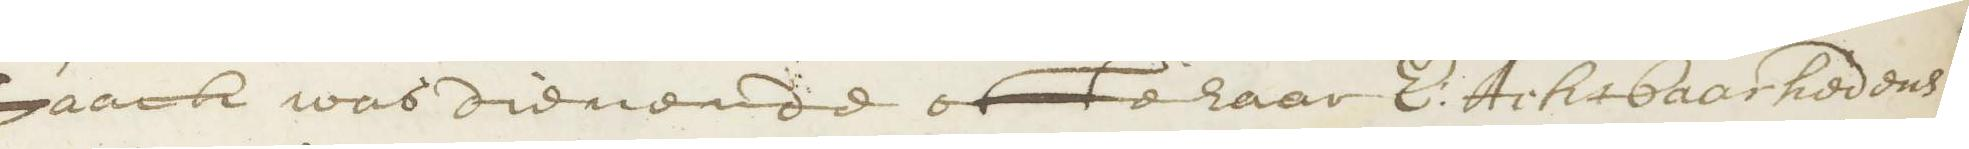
Saack was dienende offe haar E: Achtbaarhedens
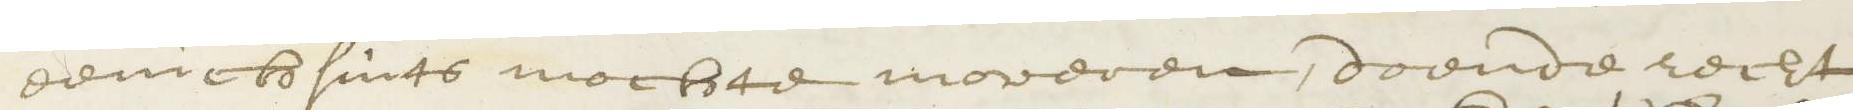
eenichsints mochte moveren, doende recht
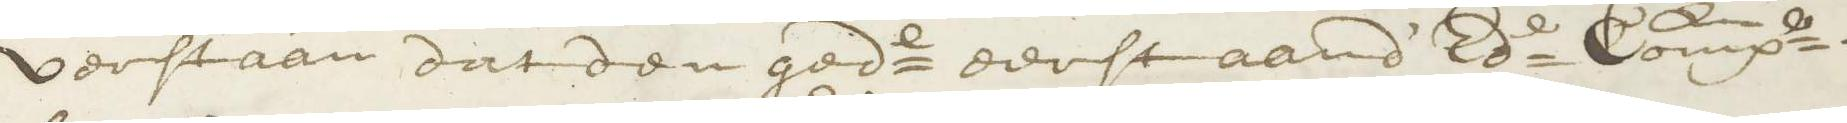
verstaan dat den ged=e eerst aan d’ Ed=e Comp=e
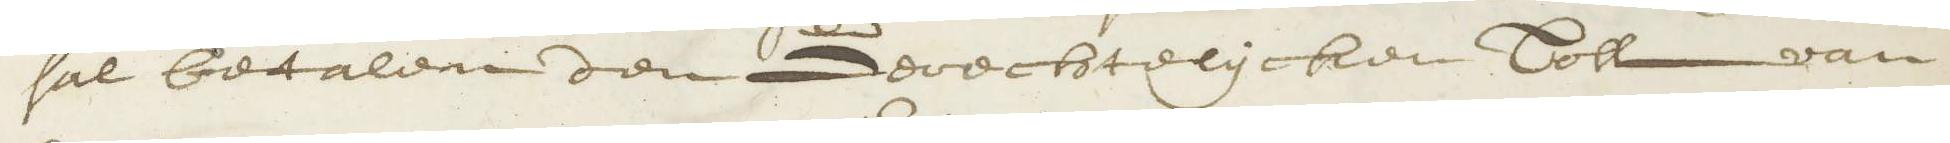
sal betalen den Gerechtelijcken Coll van
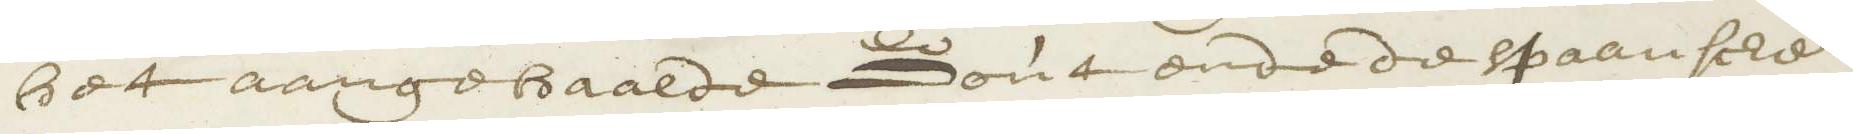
het aangehaalde Gout eude de spaansche
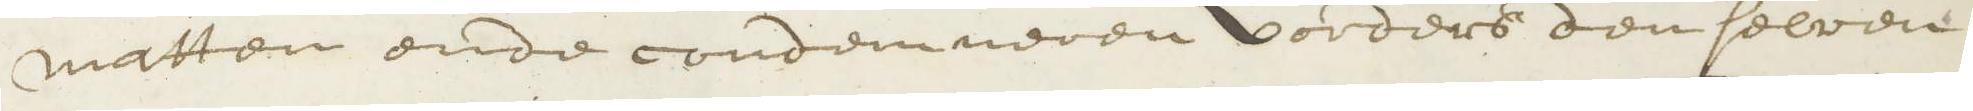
matten ende condemneren vorders den selven
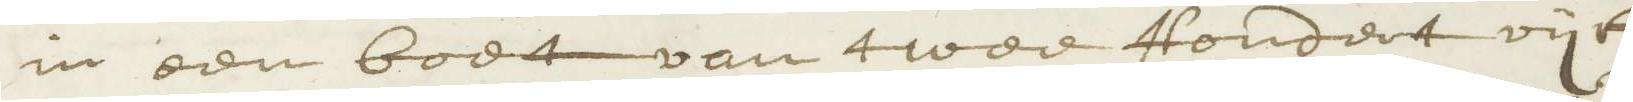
in den boet van twee Hondert vijff en
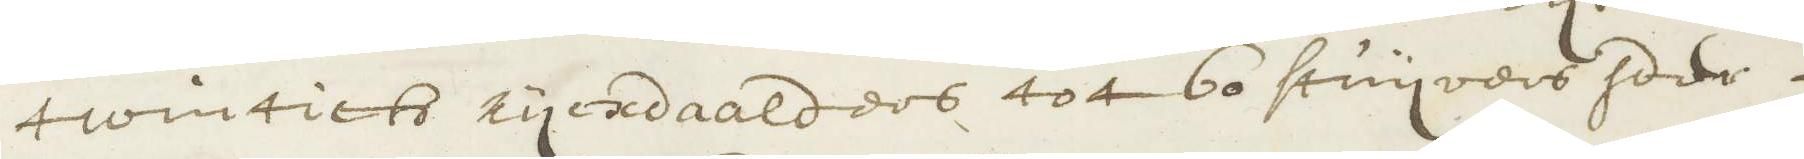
twintich rijcxdaalders tot 60 stuijvers jder
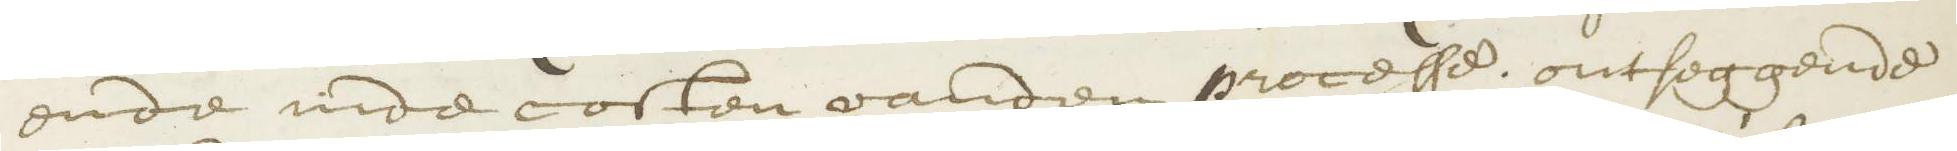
ende inde costen vanden processe. ontseggende
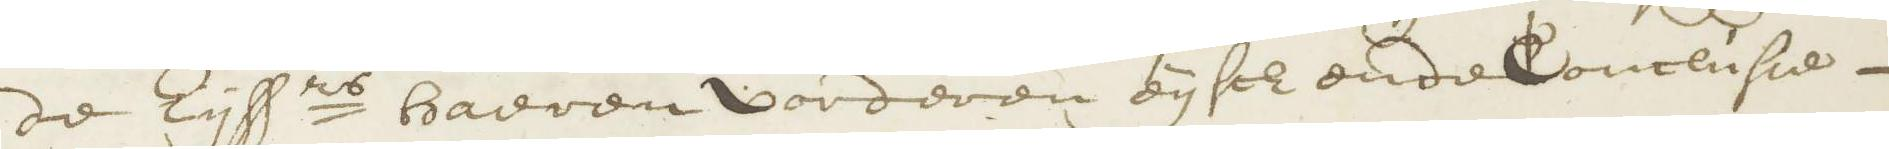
de Eijss=rs haeren vorderen eijsch ende Conclusie
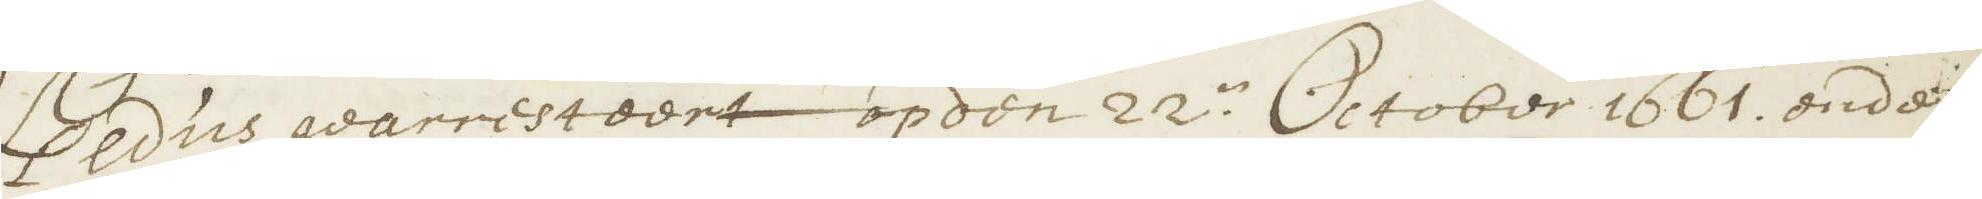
Aldus gearresteert op den 22.' October 1661. onder
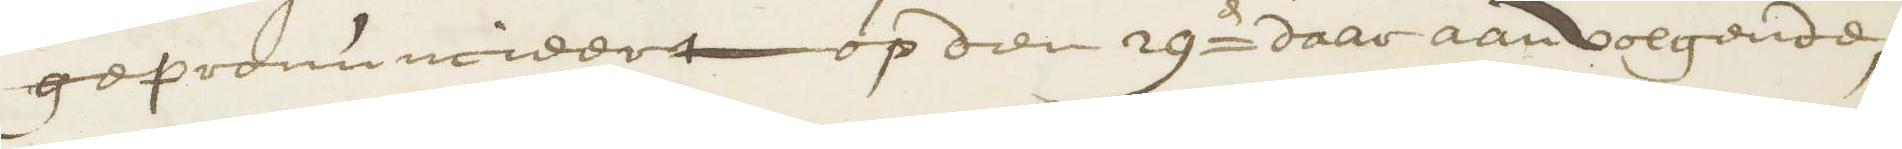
gepronuncieert op den 29=en daar aanvolgende,
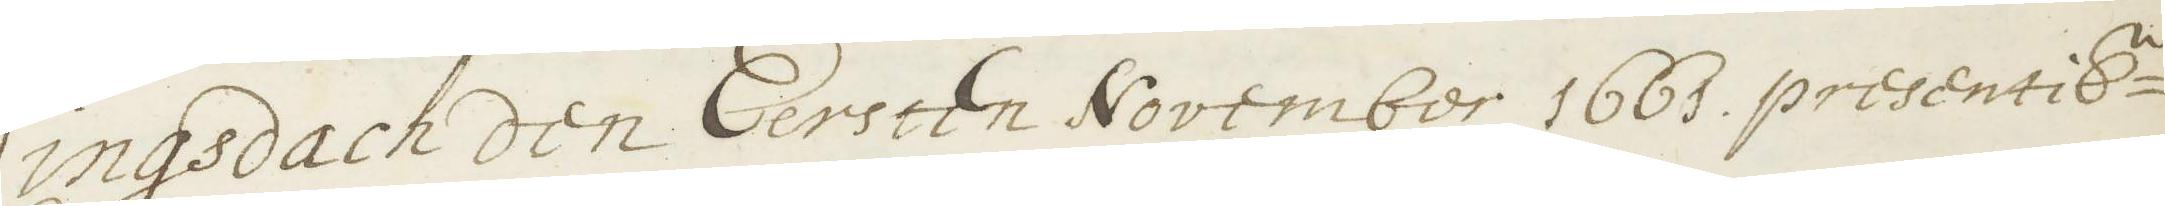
Dingsdach den Eersten November 1661. presentib=
